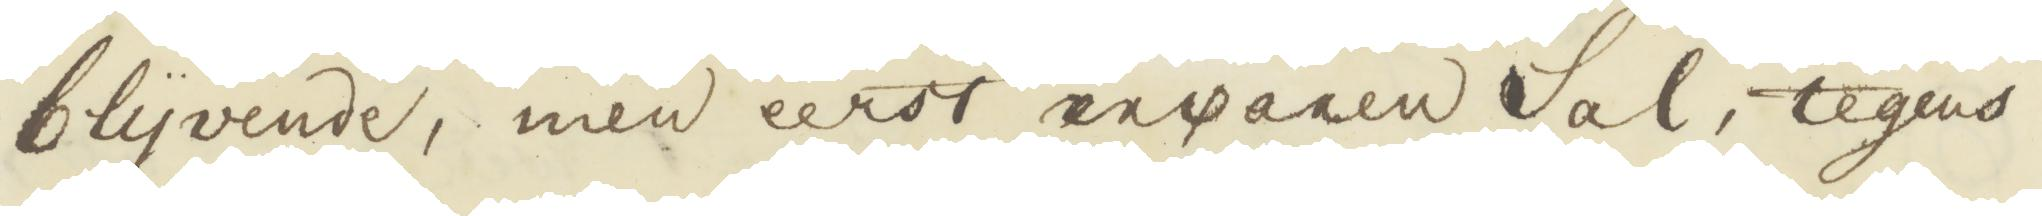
blijvende, men eerst ervaren Sal, tegens
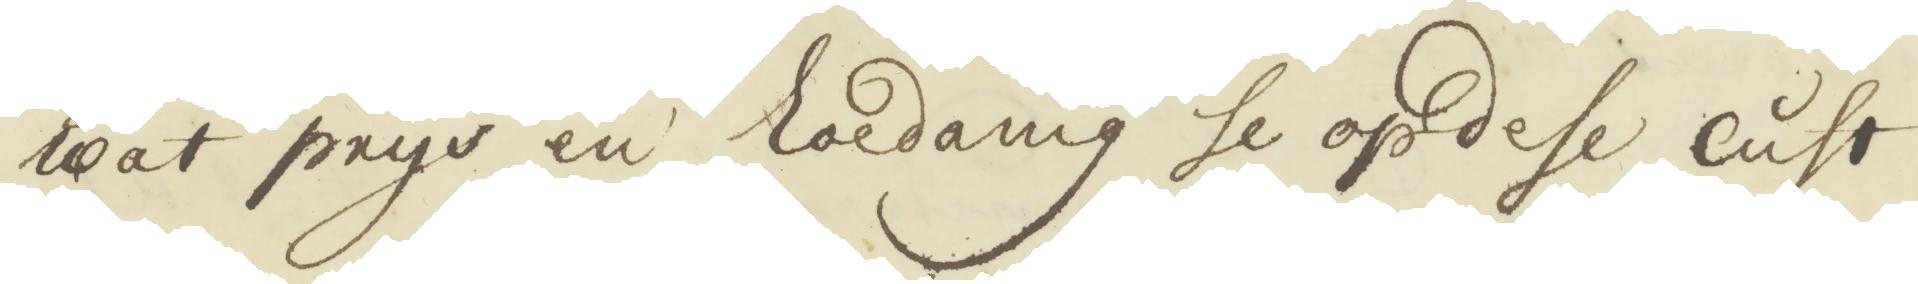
wat prijs en hoedanig se op dese cust
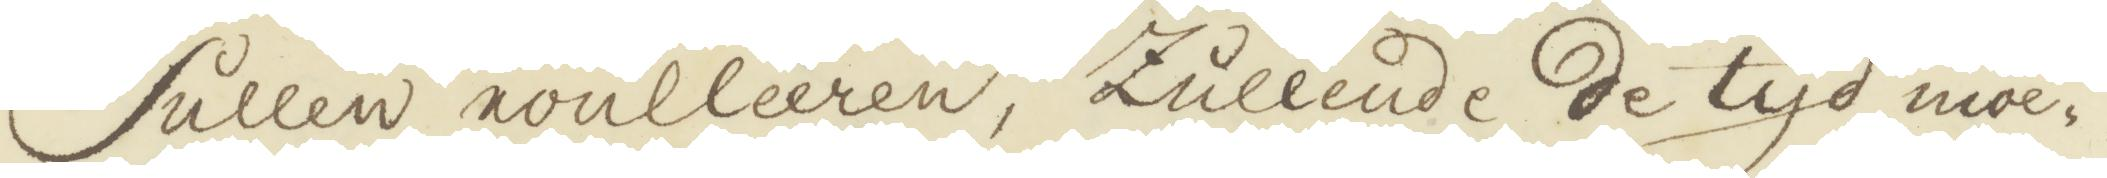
Sullen roulleeren, Zullende de tijd moe„
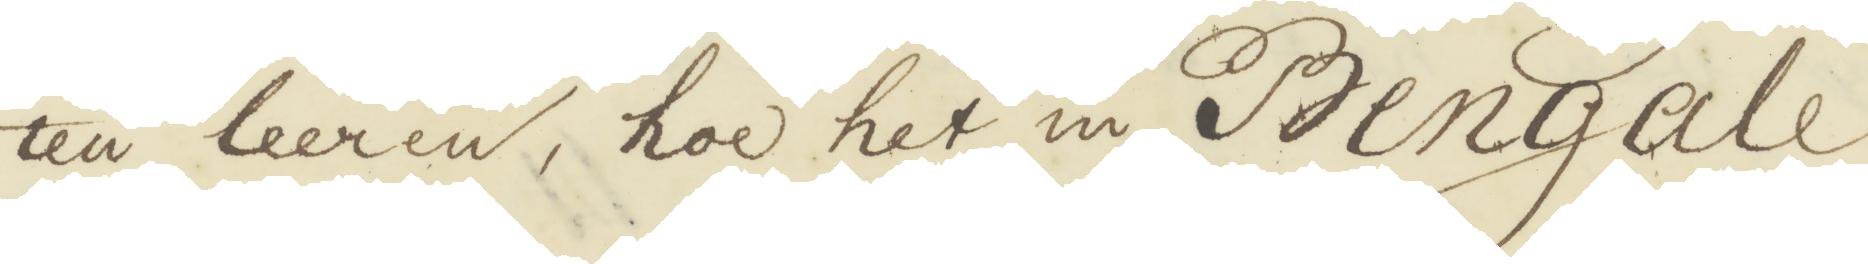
ten leeren, hoe het in Bengale
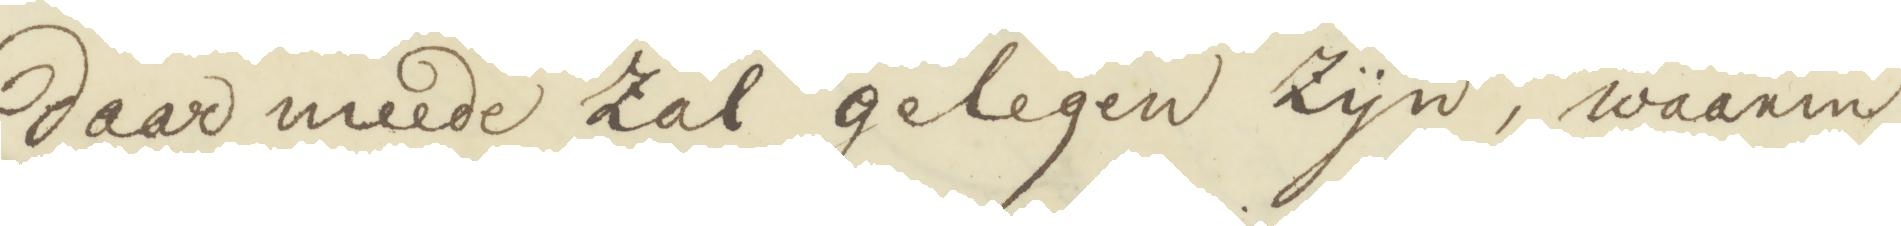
daar meede Zal gelegen Zijn, waarin
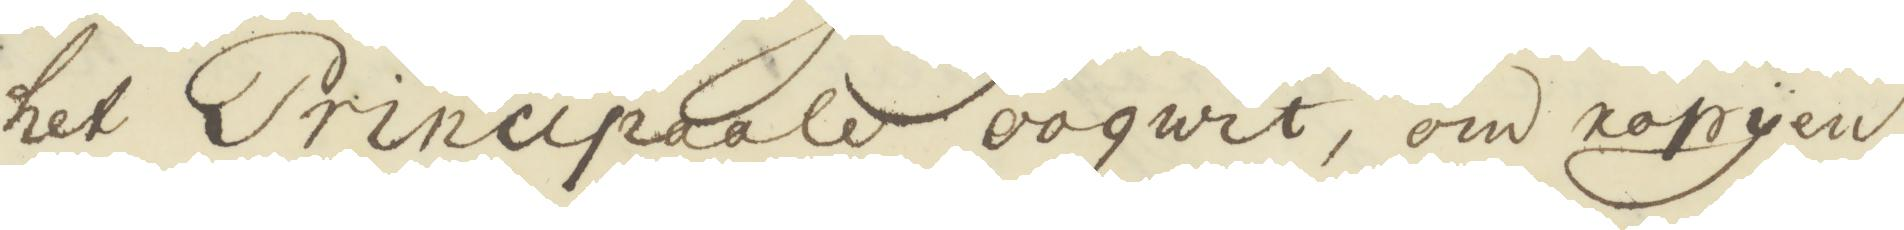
het Principaale oogwit, om ropijen
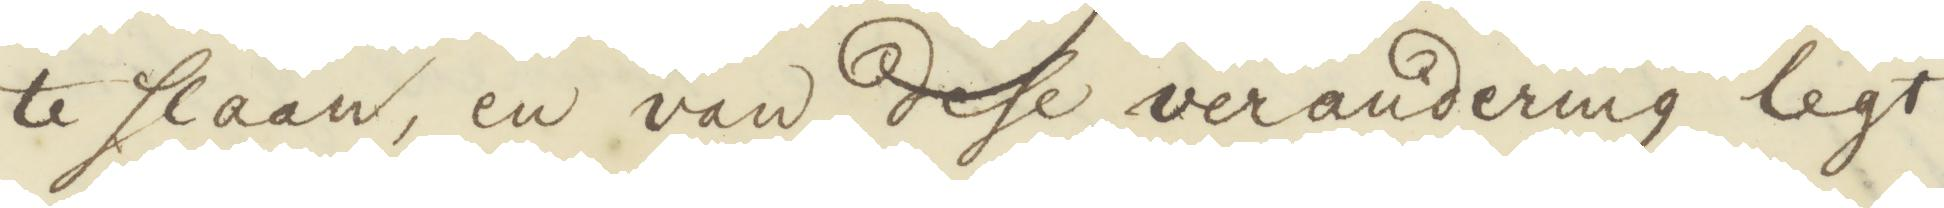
te slaan, en van dese verandering legt
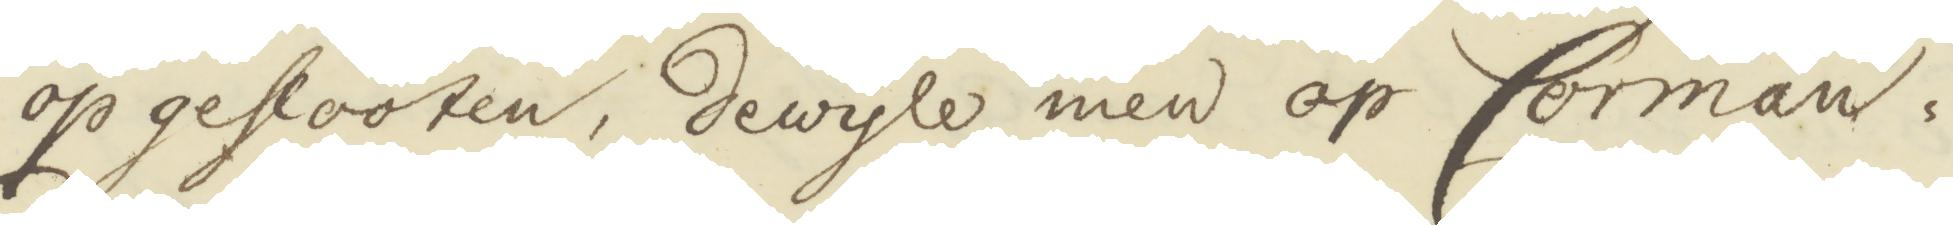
op geslooten, dewijle men op Corman„
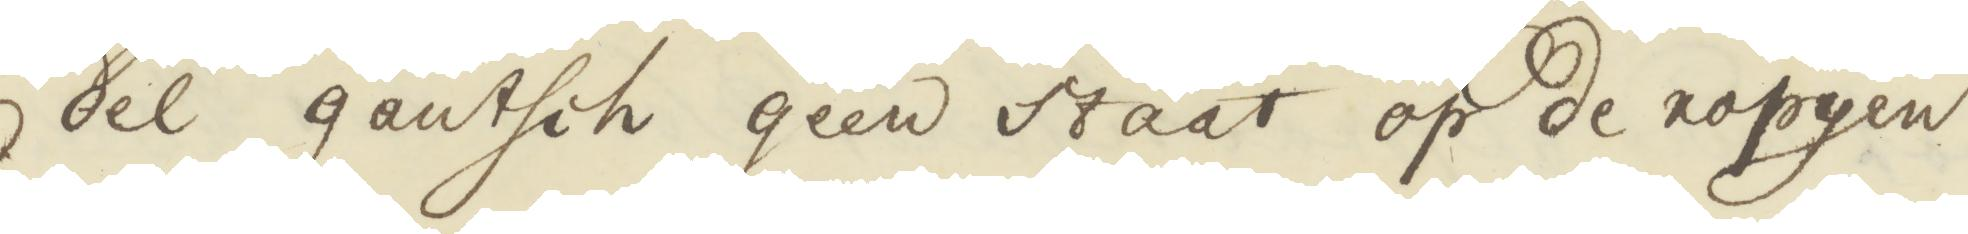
del gantsch geen staat op de ropijen
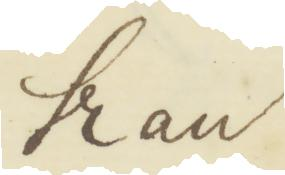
kan
